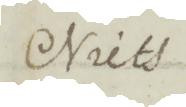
Niets
